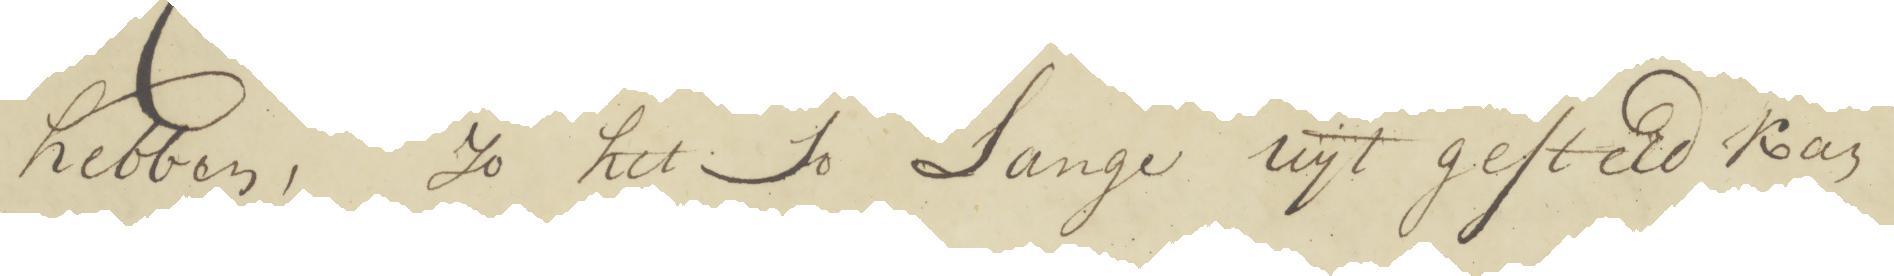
hebben, zo het so lange uijt gesteld kan
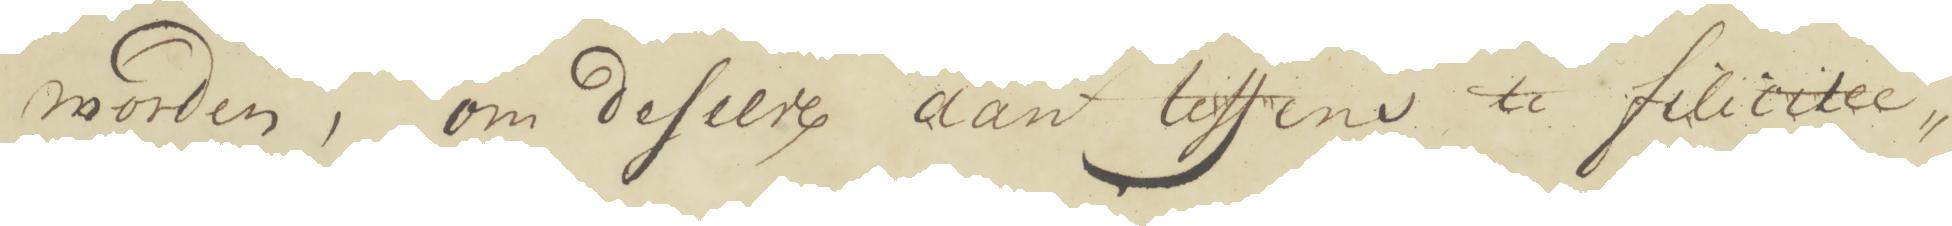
worden, om deselve dan teffens te filicitee„
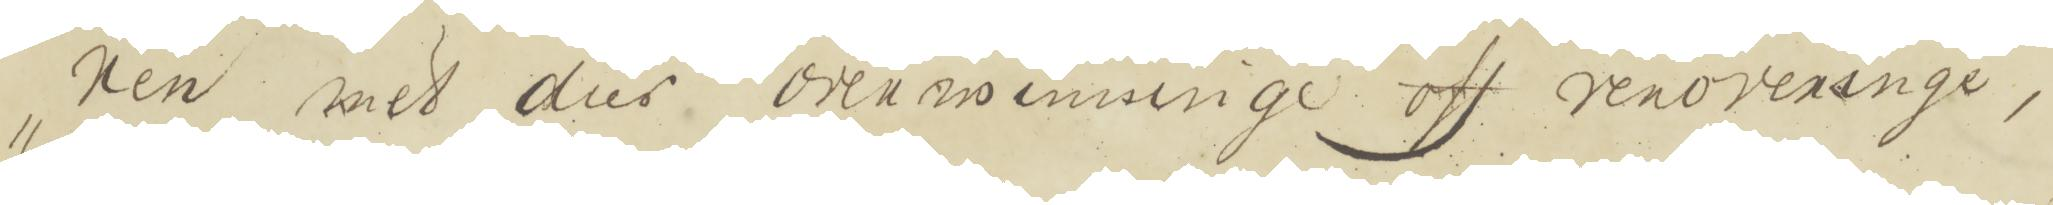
„ren met dies overwinninge off veroveringe,
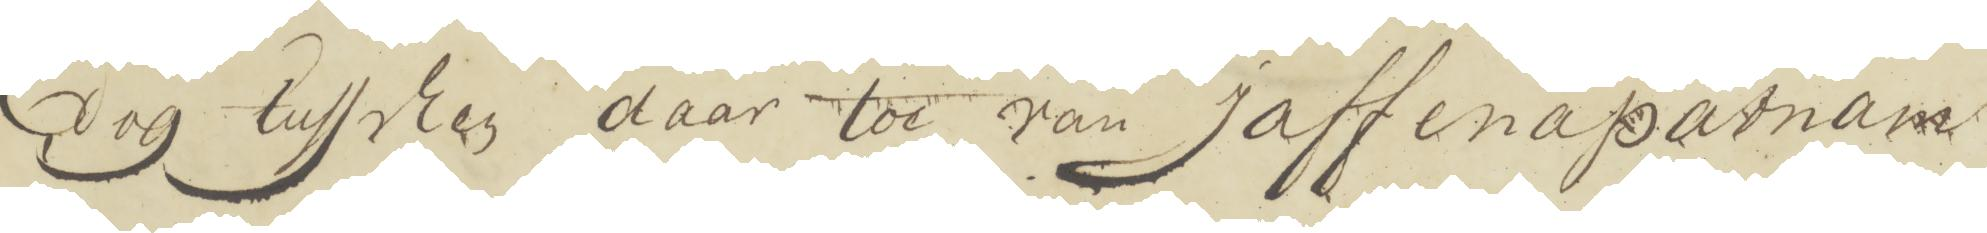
dog tusschen daar toe van Jaffenapatnam
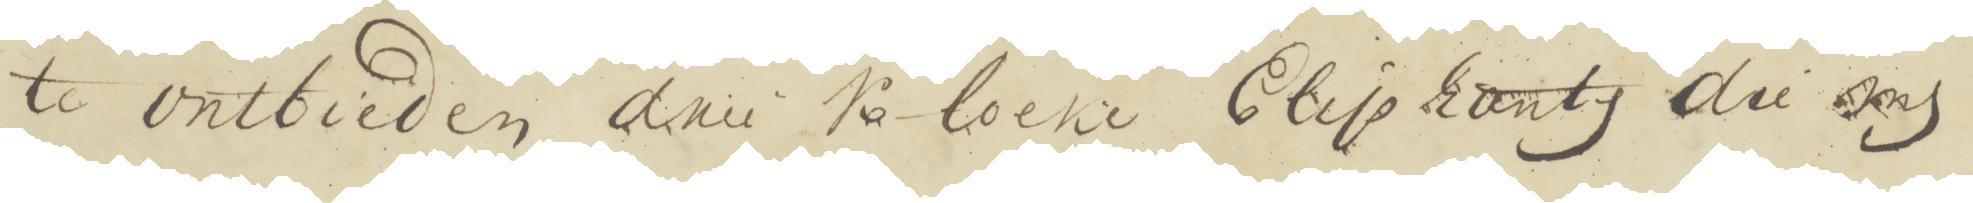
te ontbieden drie kloeke Eliphanten die men
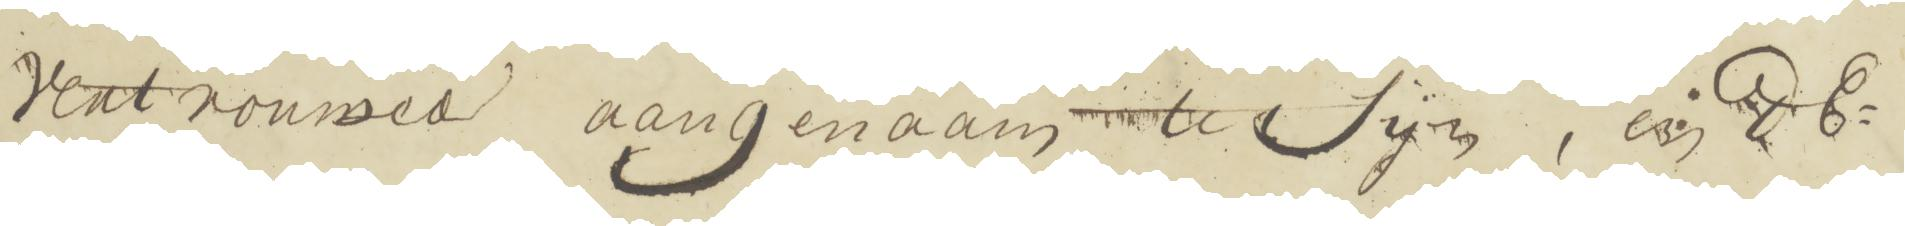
vertrouwede aangenaam te sijn, en dE:
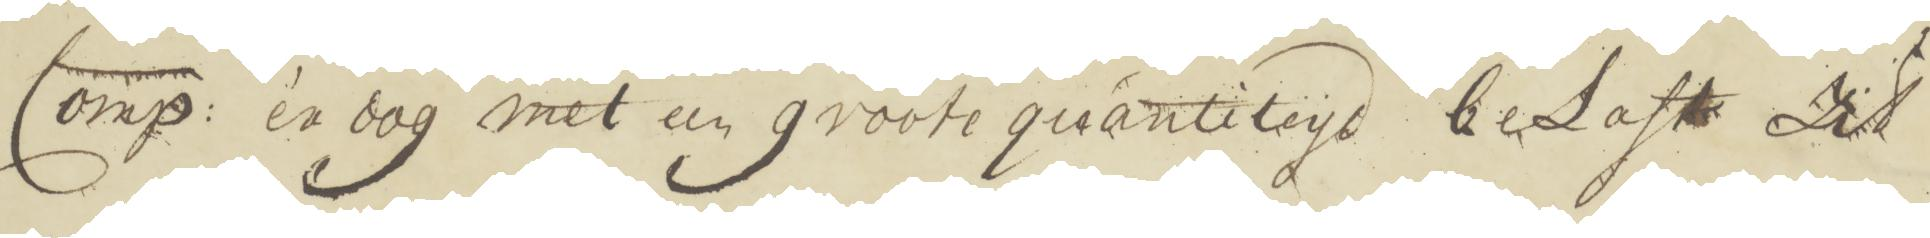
Comp: 'er dog met een groote quantiteijd belast zit
